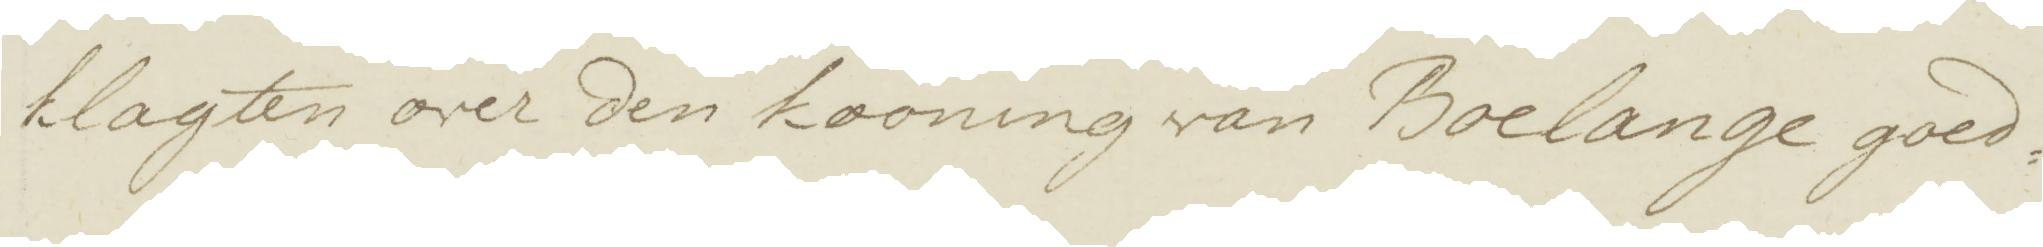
klagten over den kooning van Boelange goed
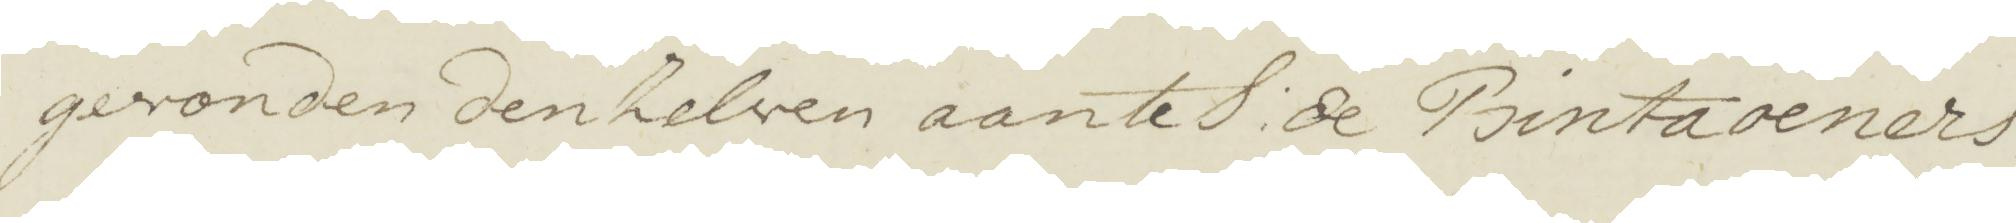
gevonden den zelven aantes: de Bintaoeners
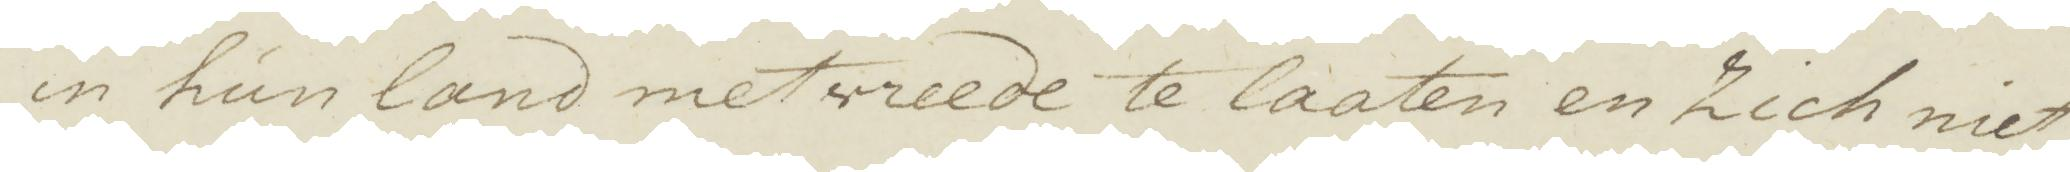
in hun land met vreede te laaten en zich niet
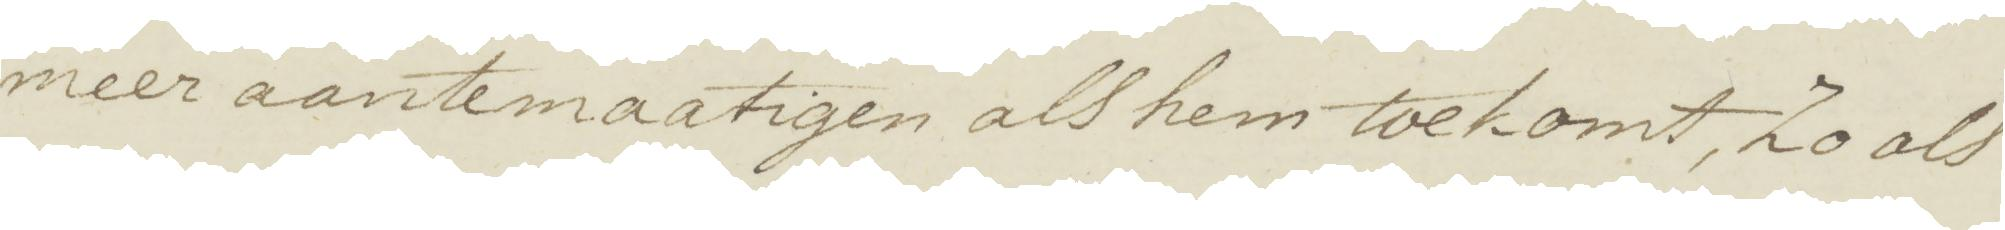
meer aantemaatigen als hem toekomt, zo als
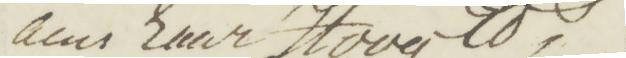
aens haar Hoog Ed„s
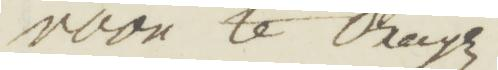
voor te dragen
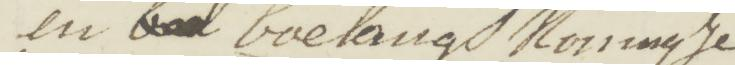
en bel boelangs Koningje
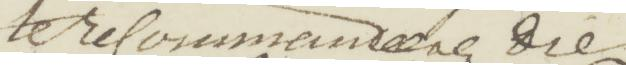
te recommandeeren die
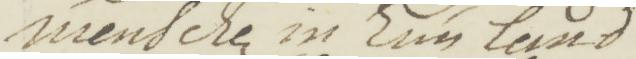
menschen in hun land
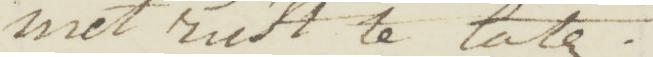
met rust te laten.
